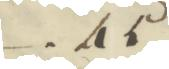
—. 45
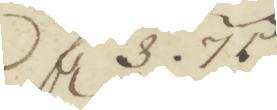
ƒ 3.75
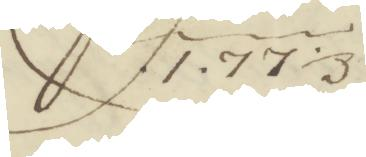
1.773
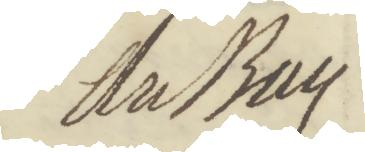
: du Buy
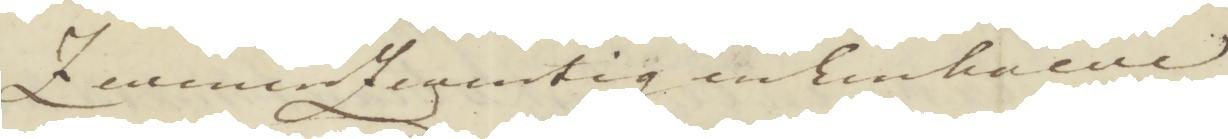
ZevenenZeventig en Een halve
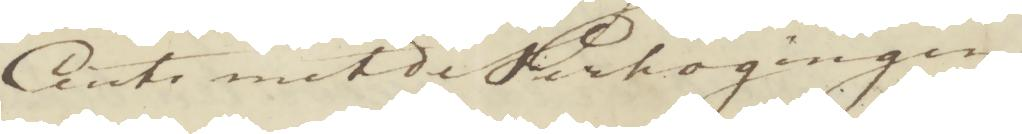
Cents met de Verhogingen
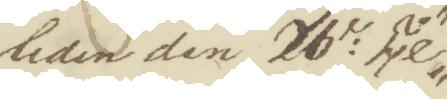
leden den 26:e Fe
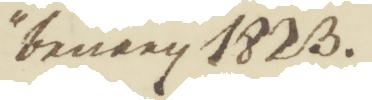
bruary 1823.
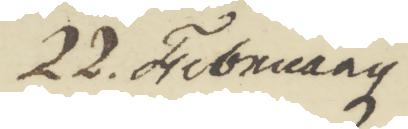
22. February
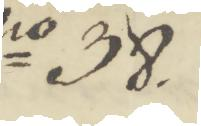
=o 38.
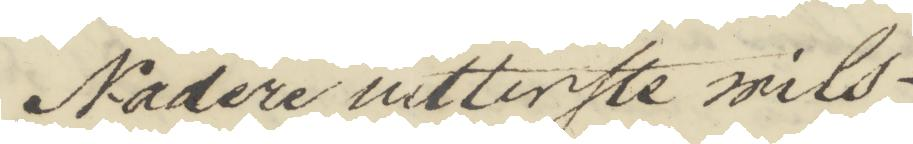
Nadere uitterste wils
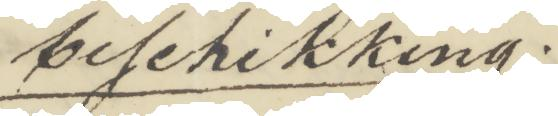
beschikking:
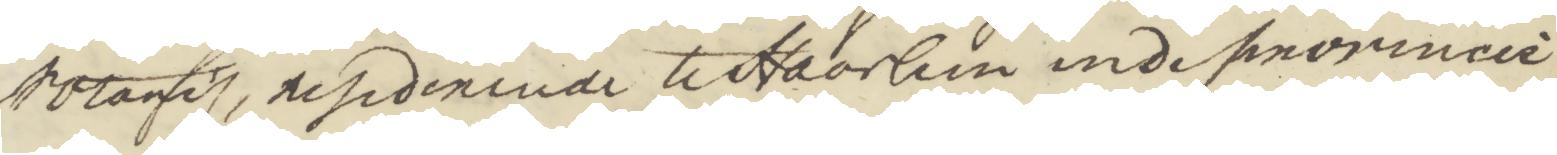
Notaris, residerende te Haarlem in de provincie
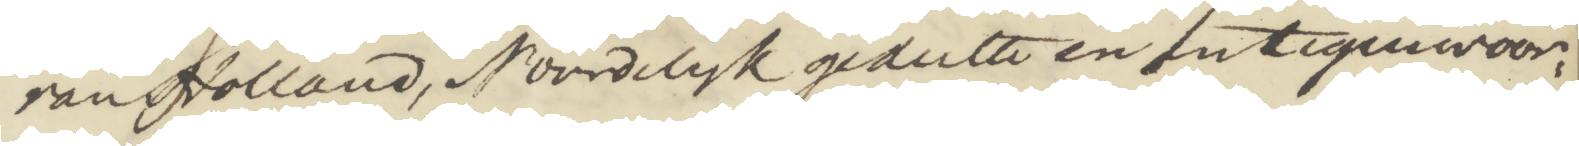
van Holland, Noordelijk gedeelte en integenwoor:
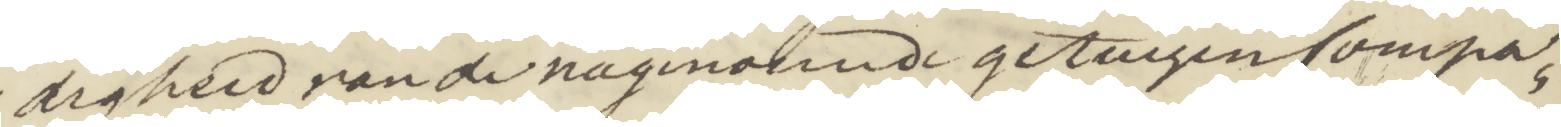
„digheid van de nagenoemde getuigen Compa:
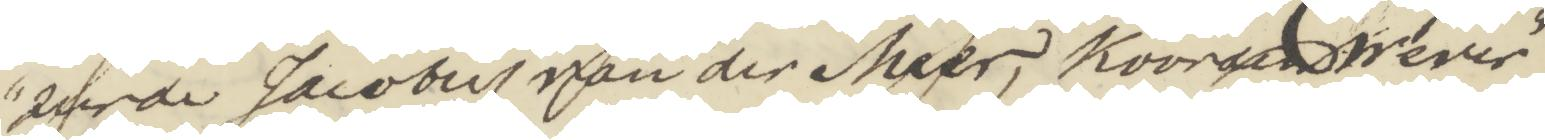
„reerde Jacobus van der Meer, Koorden Wever
